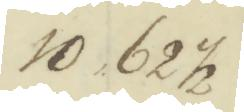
10„62½
